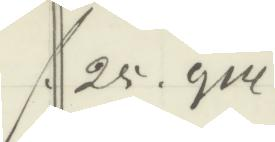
ƒ 25. 914
